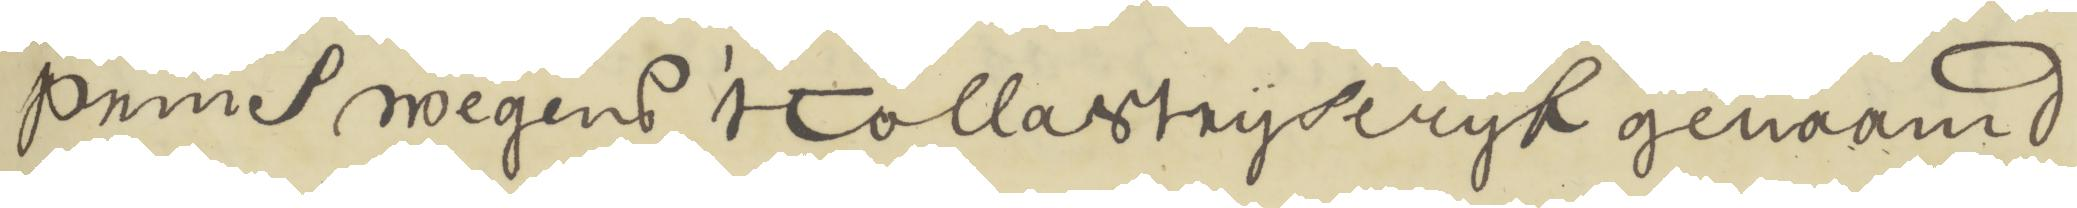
prins wegens ’t Collastrijse rijk genaamd
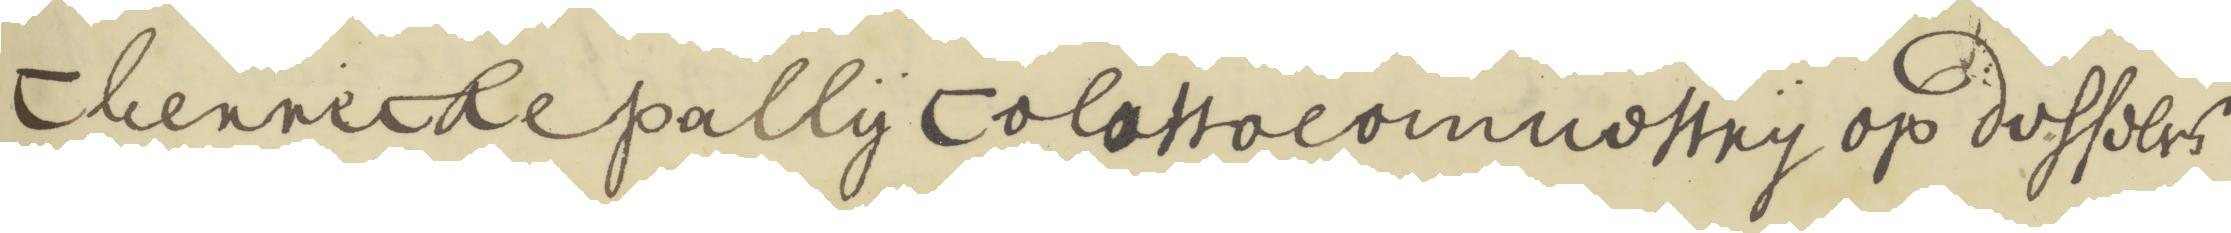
Cherrickepallij colottoeomnettrij op desselvs
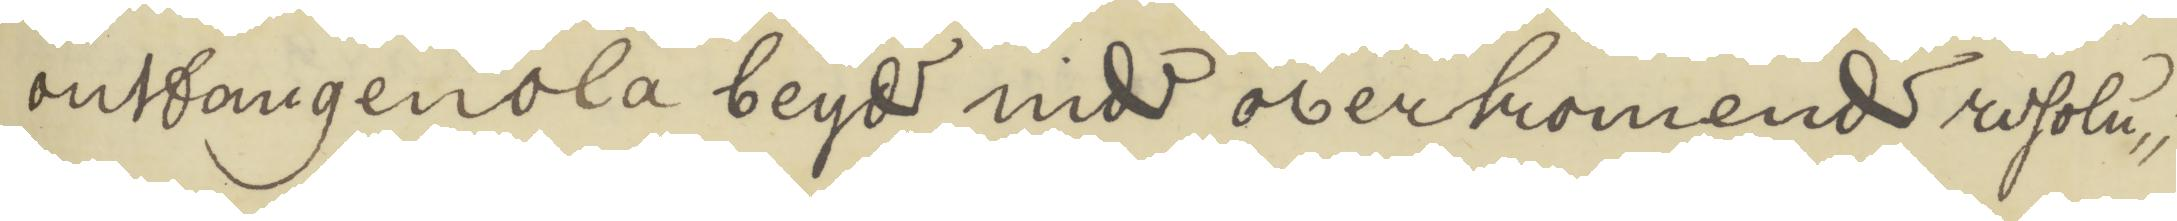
ontfangen ola beijde inde overkomende resolu„
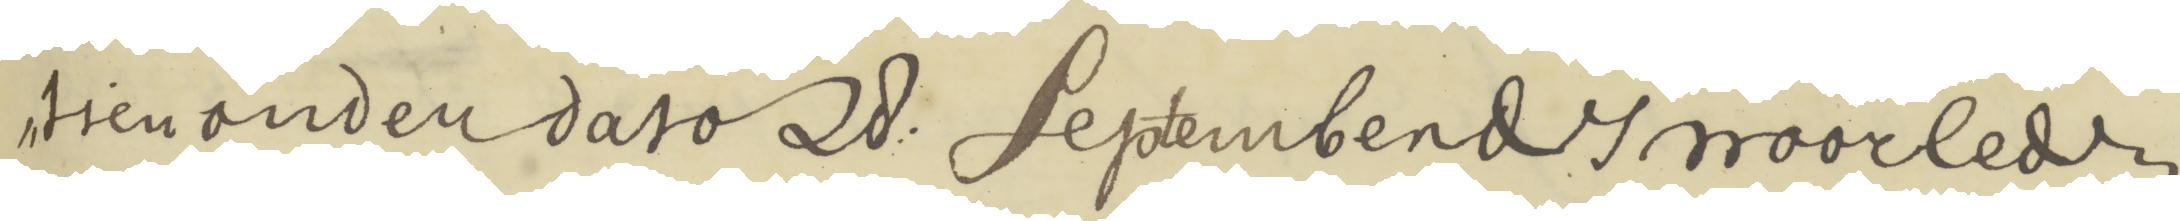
„tien onder dato 28: Sepember des voorleden
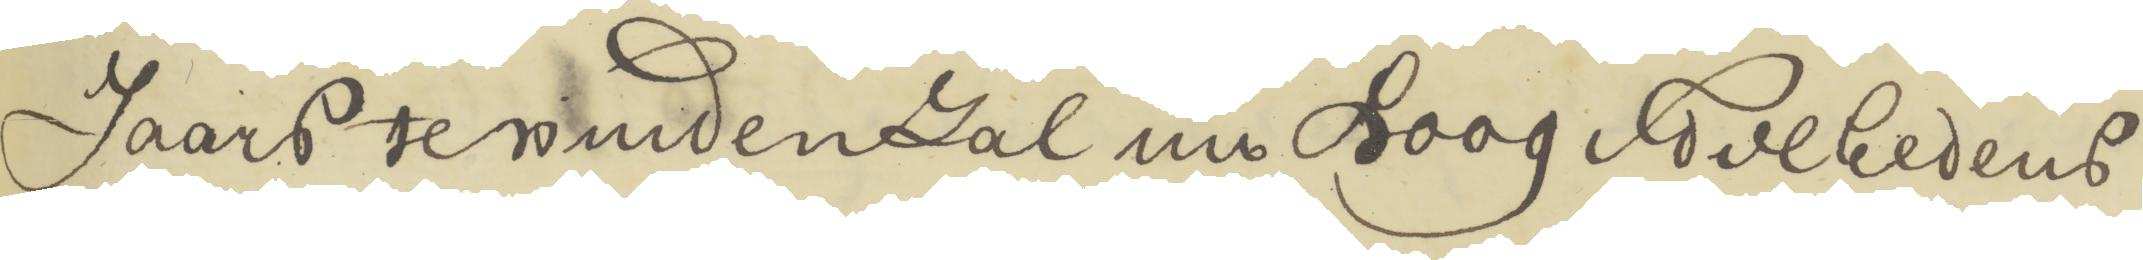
Jaars te vinden zal uw Hoog Edelhedens
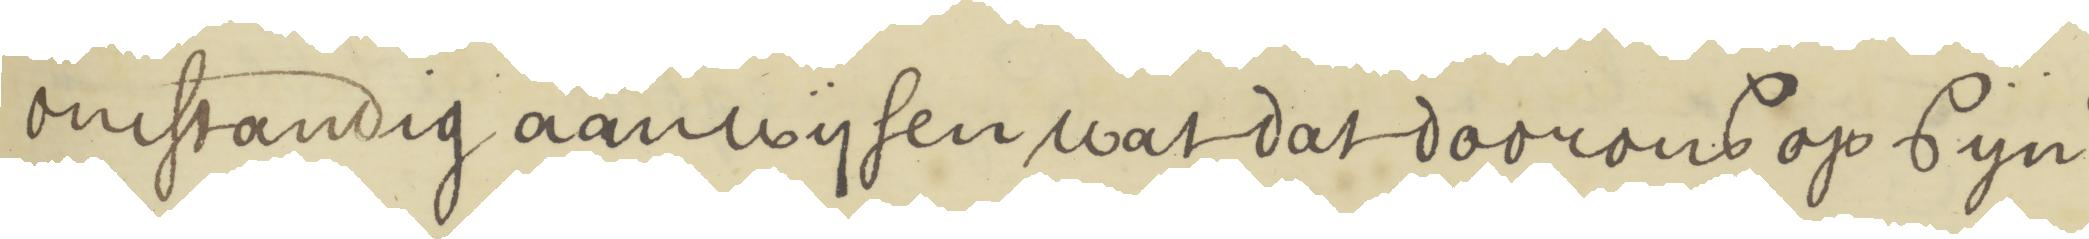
omstandig aanwijsen wat dat door ons op sijn
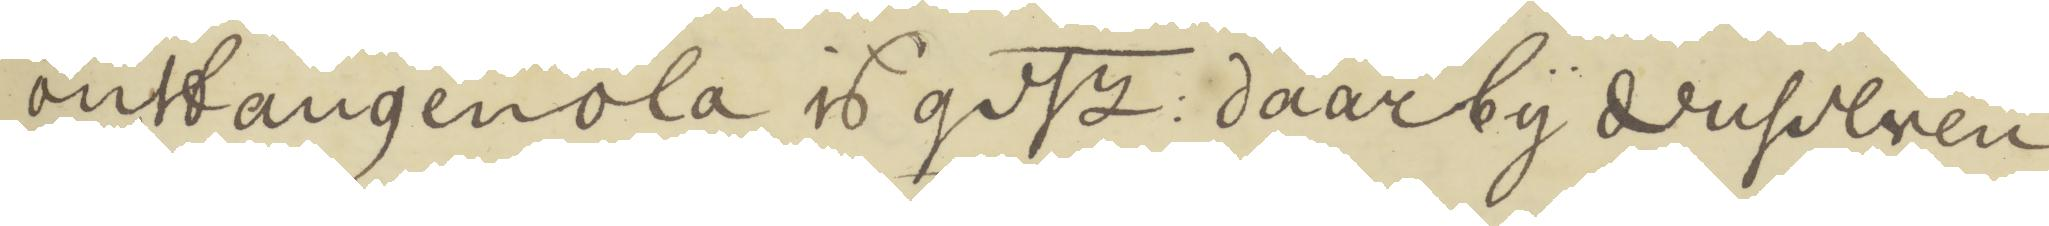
ontfangen ola is gesz: daar bij denselven
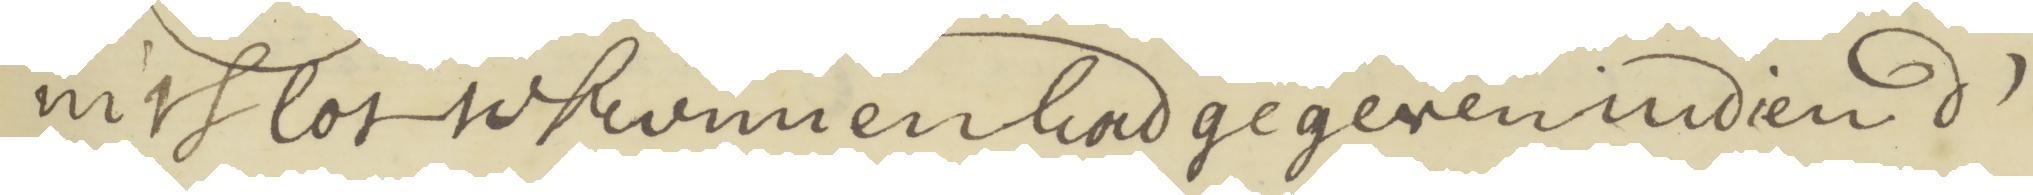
in 'tslot te kennen had gegeven indien d’
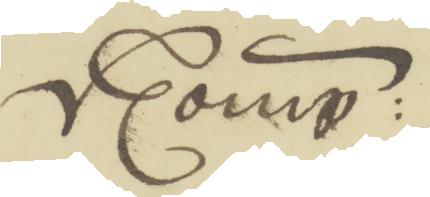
EComp:
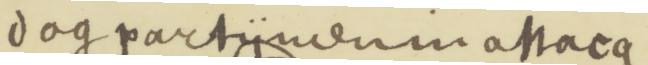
dog partijnen in attacq
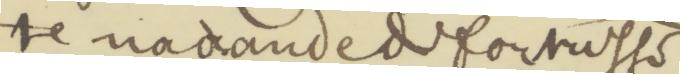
te nadande de fortresse
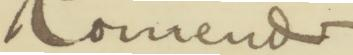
komende
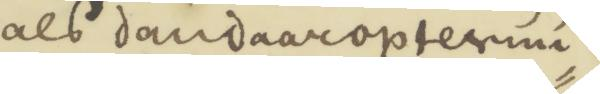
als dan daar op te vuu„
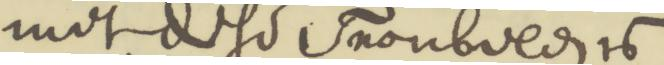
met dese Troubelen is
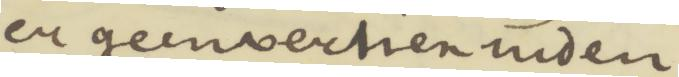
er geen vertier inden
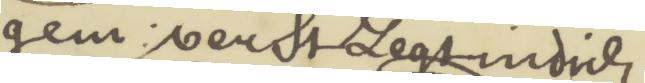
gem: vorst zegt indien
